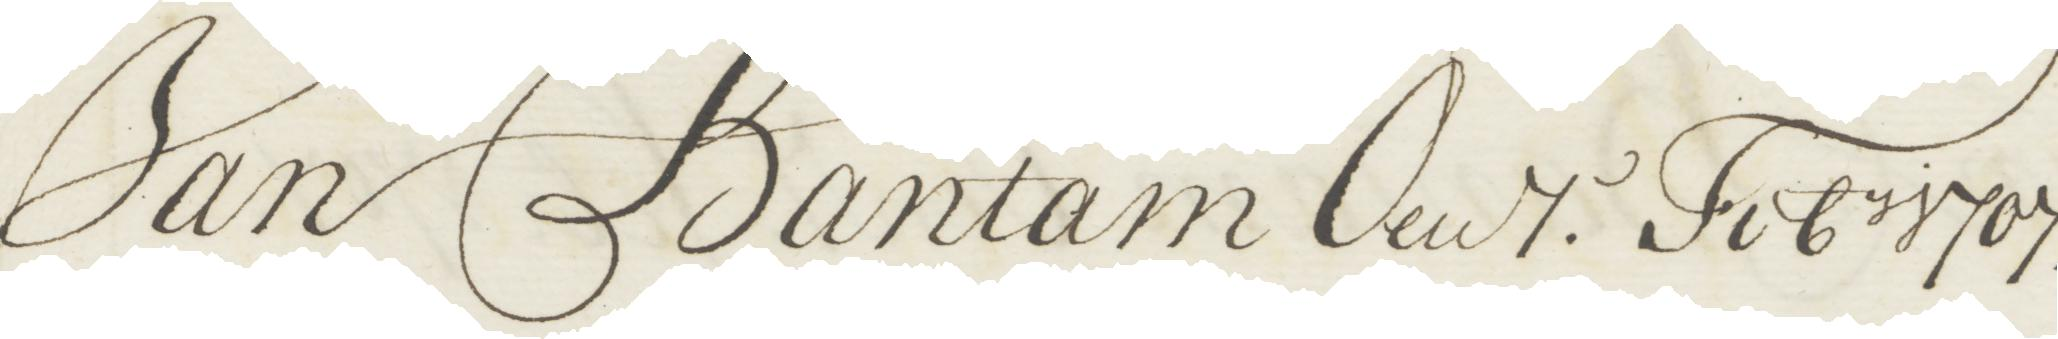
Van Bantam den 7. Feb 1707.
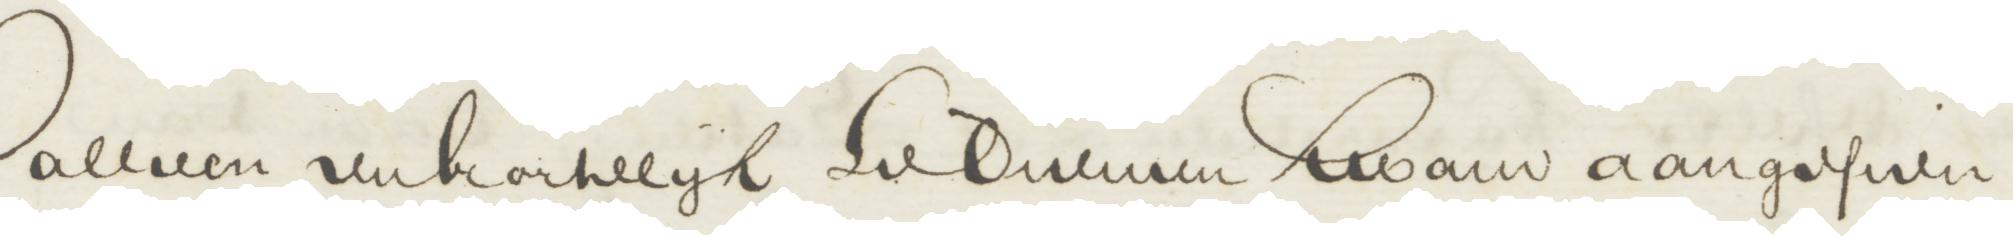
alleen enkortelijk tedienen sware aan gesien
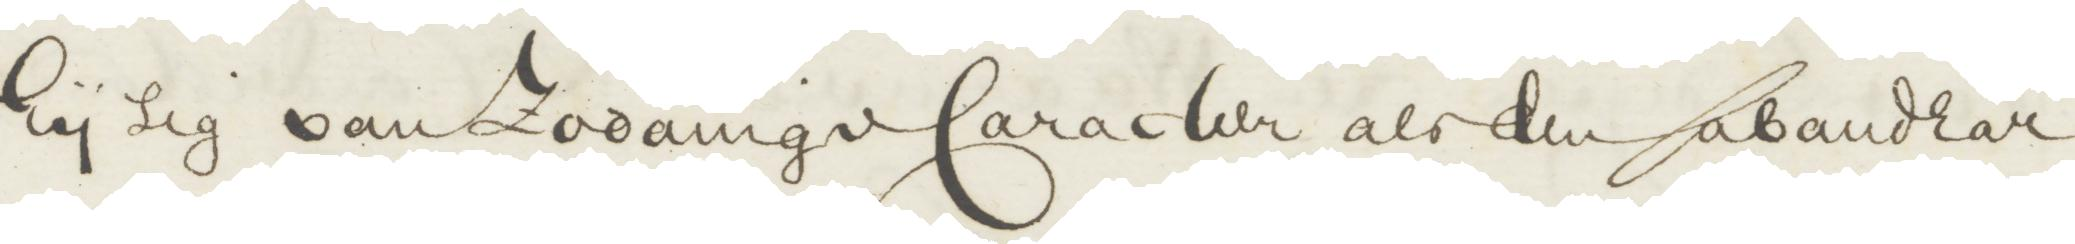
hij sig van zodanige Caracter als den fabandhar
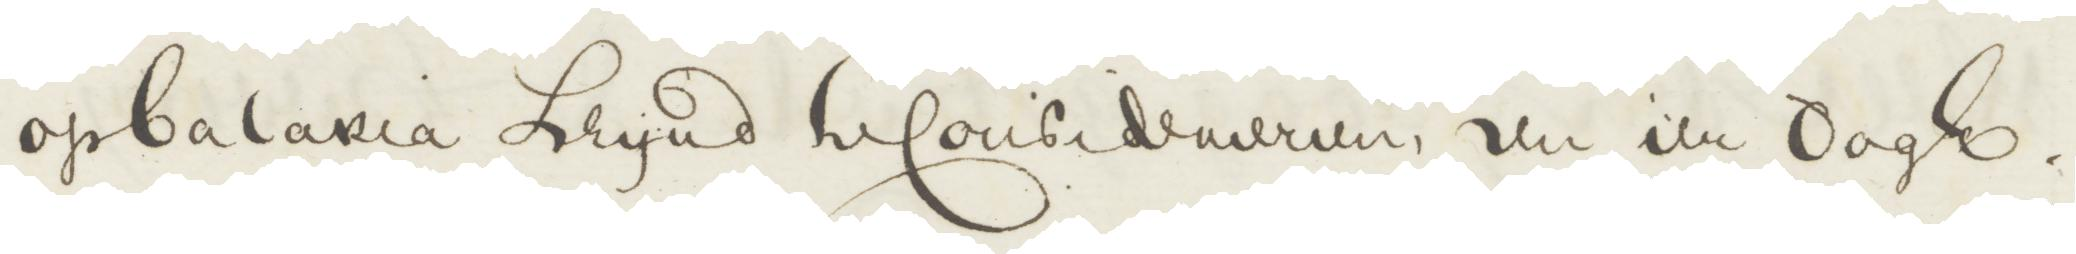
op batavia scheijnd te Considereren, en er dogh,
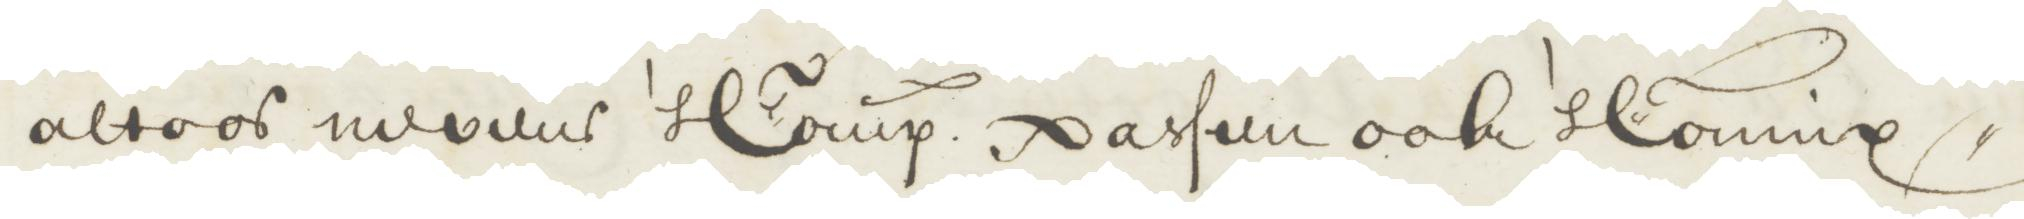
altoos nevens ’s Comp:s passen ook 'sConinx„
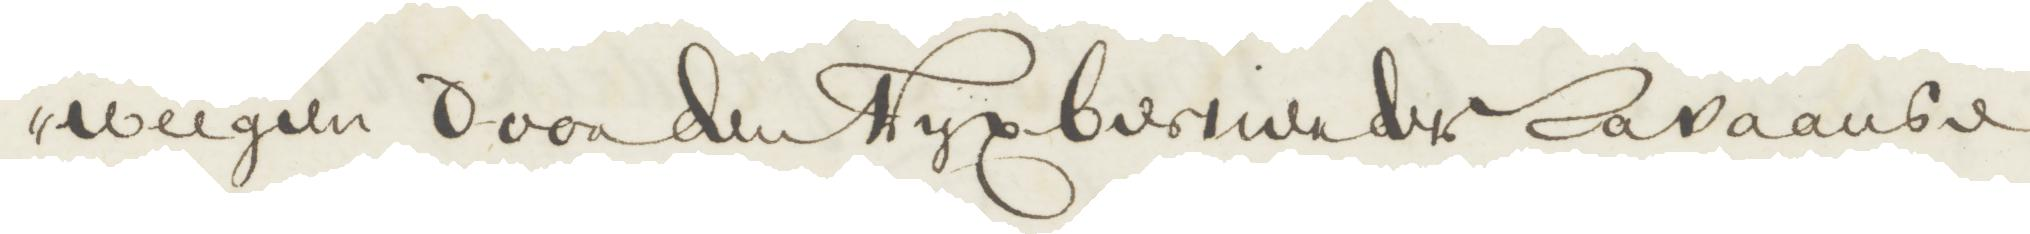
„weegen door den Rijxbestierder Iavaanse
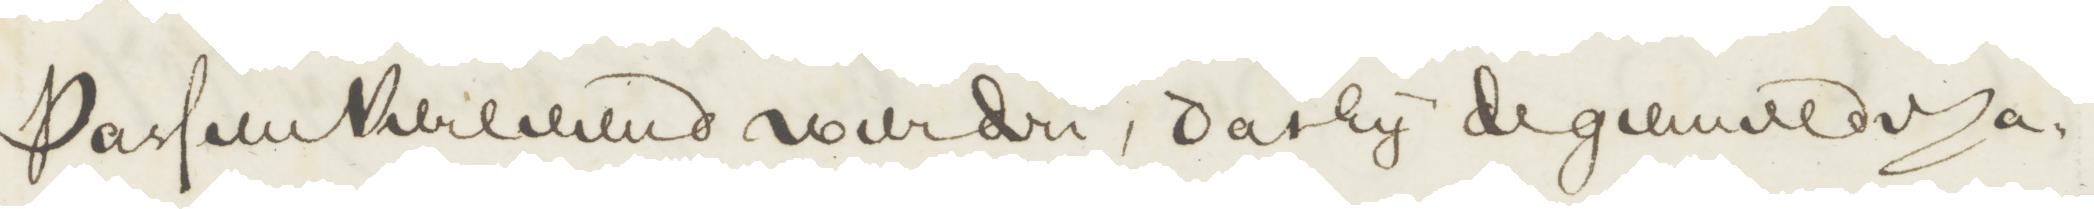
Passenverleend werden, dat hij de gemelde ja„
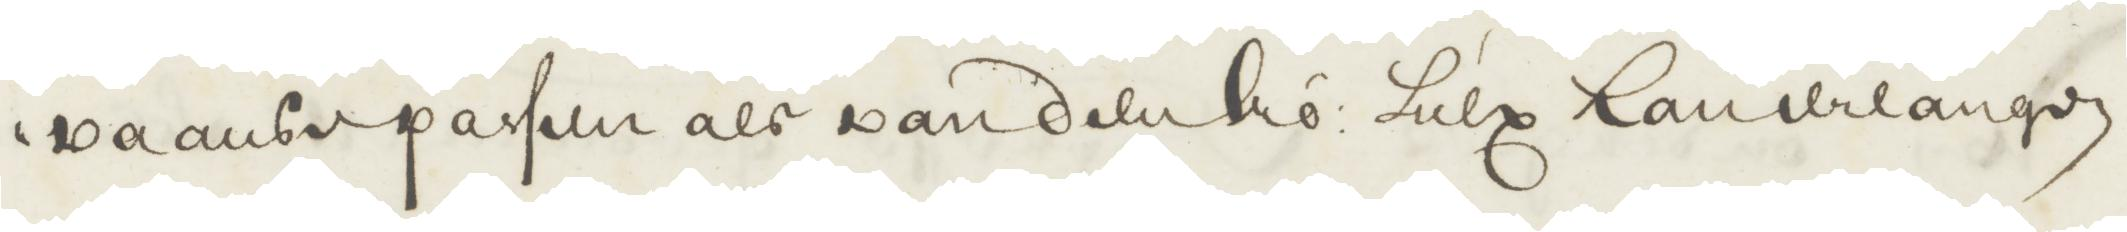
„va anse passen als van den ko: sulx kan erlangen
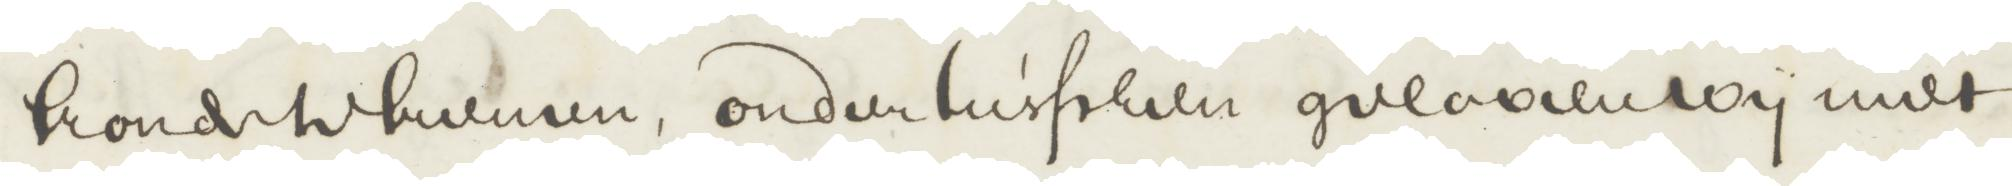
konde tekenen, onder tusschen geloven wij met
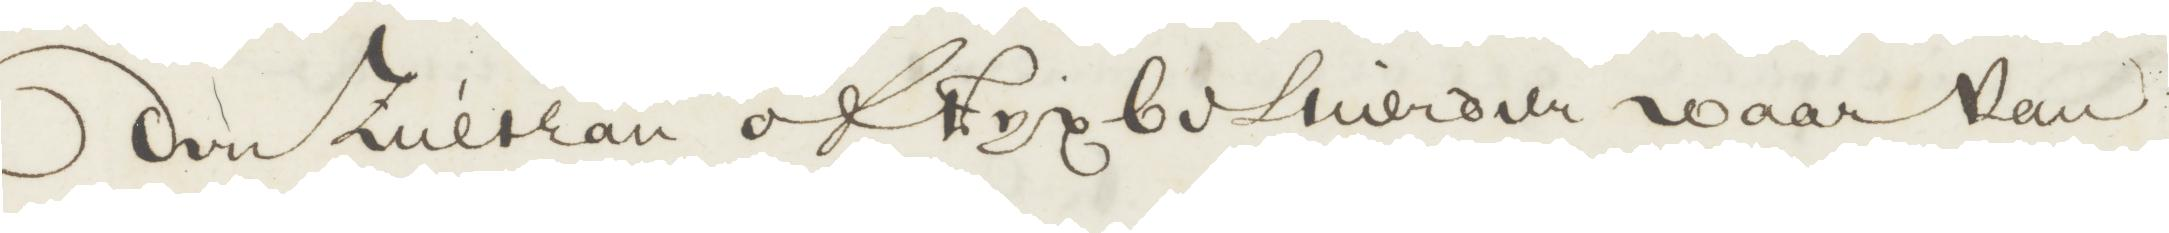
den zulthan of Rijxbestierder waar van
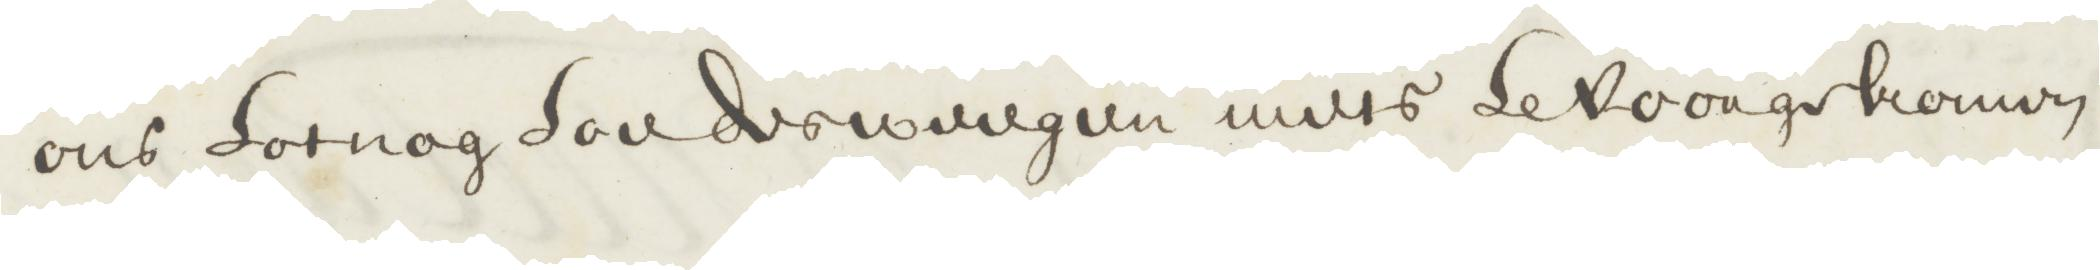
ons totnog toe desweegen niets te voor gekomen
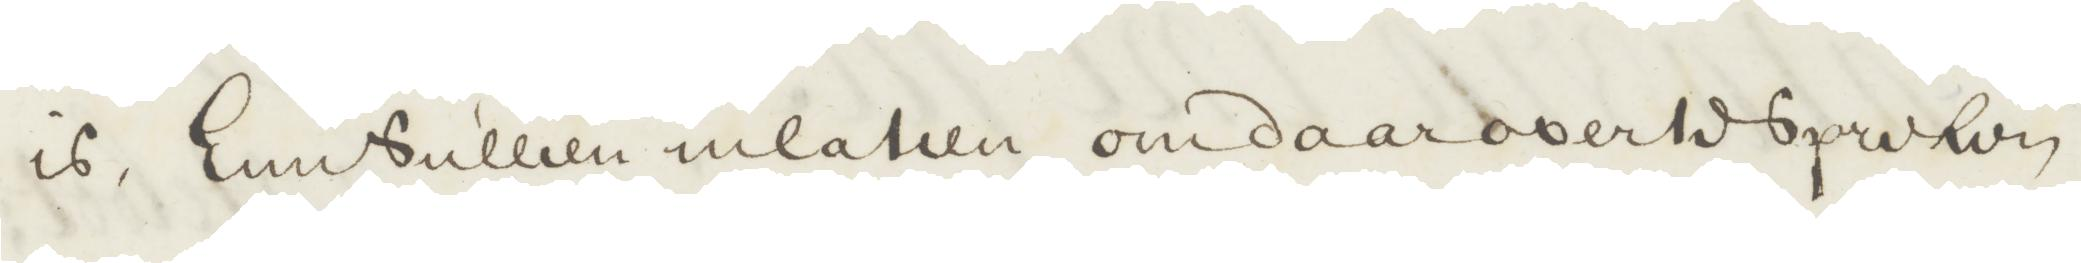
is, hun sullen inlaten om daar over te spreken
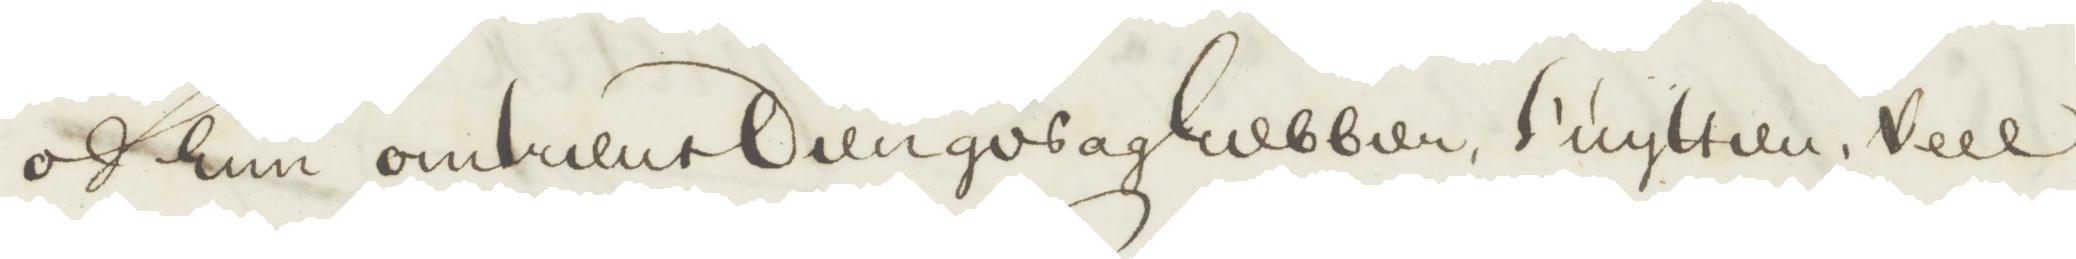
of hun omtrent den gesaghebber, t'uijtten, veel
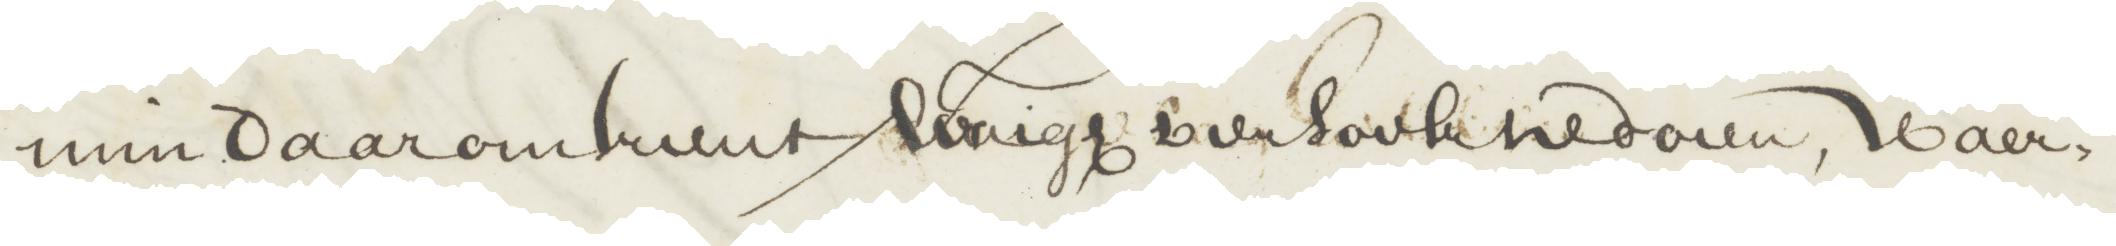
min daar omtrent Eenigh versoek tedoen, waer„
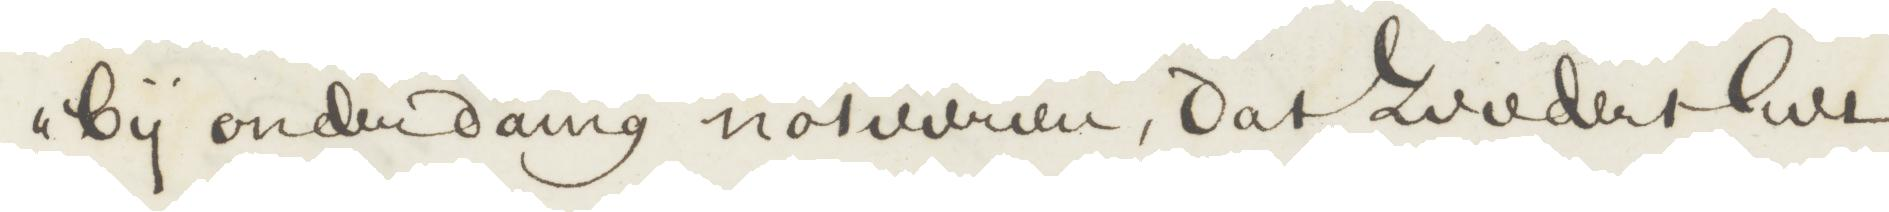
„bij onderdanig noteeren, dat zeedert het
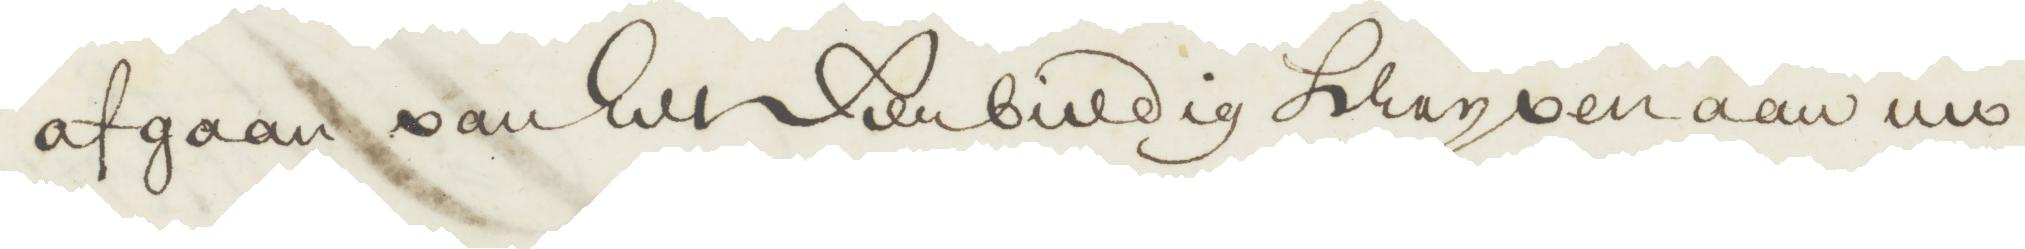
afgaan van het Eerbiedig schrijven aan uw
